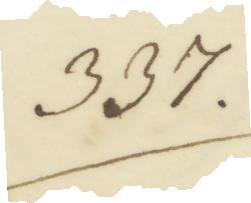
337.
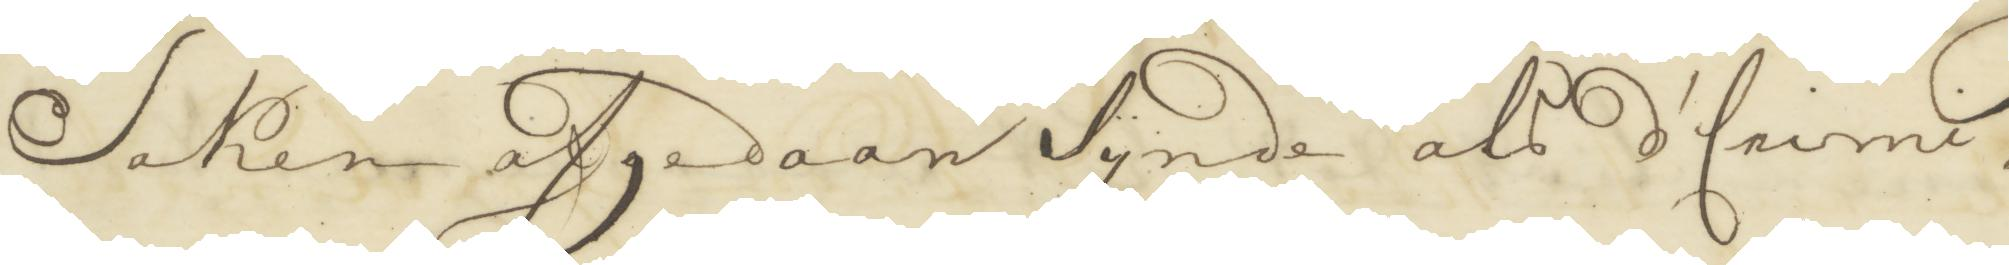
saken afgedaan sijnde als d’ Crimi
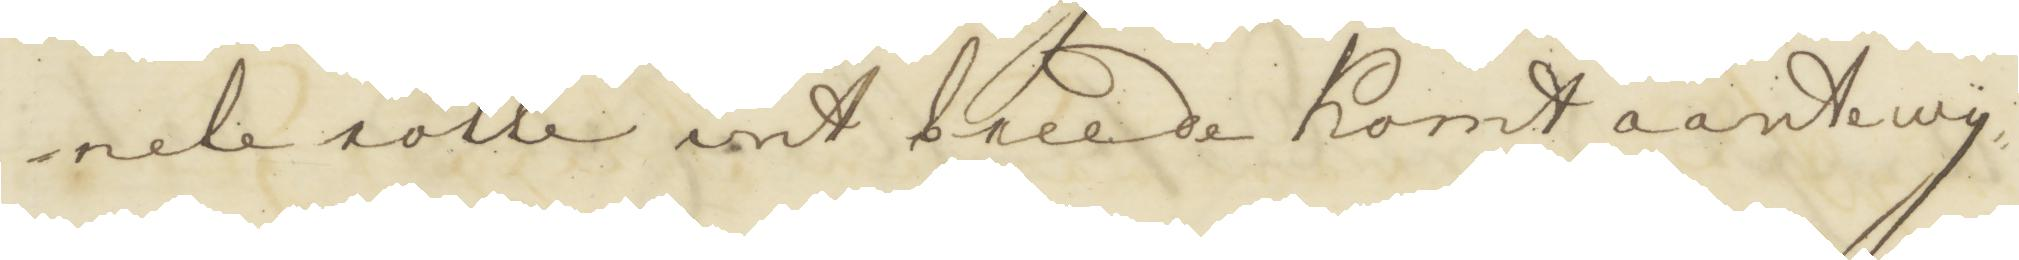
„nele rolle in't breede komt aantewij„
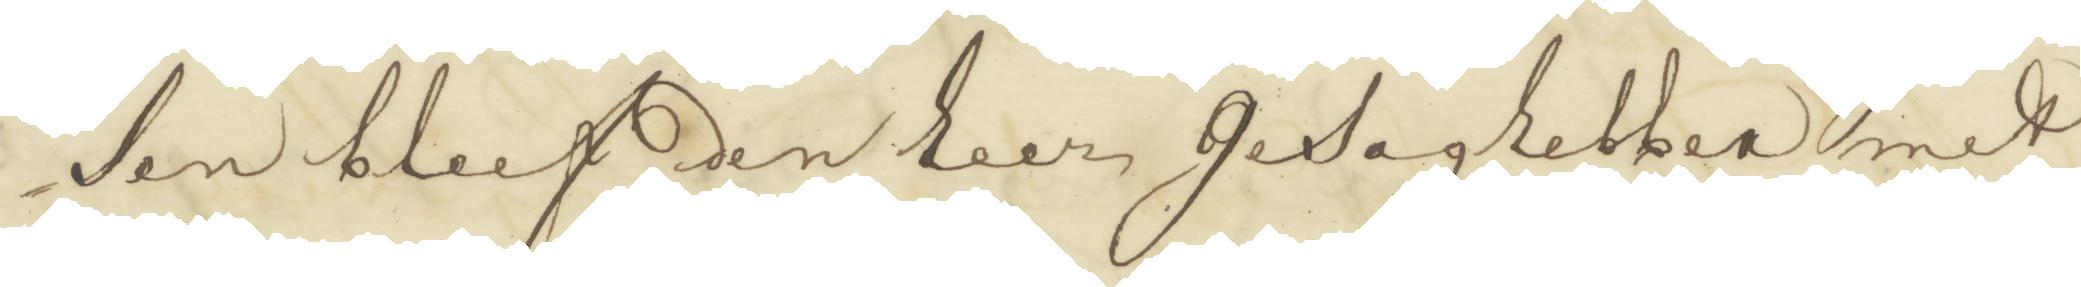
„sen bleef den heer gesaghebber met
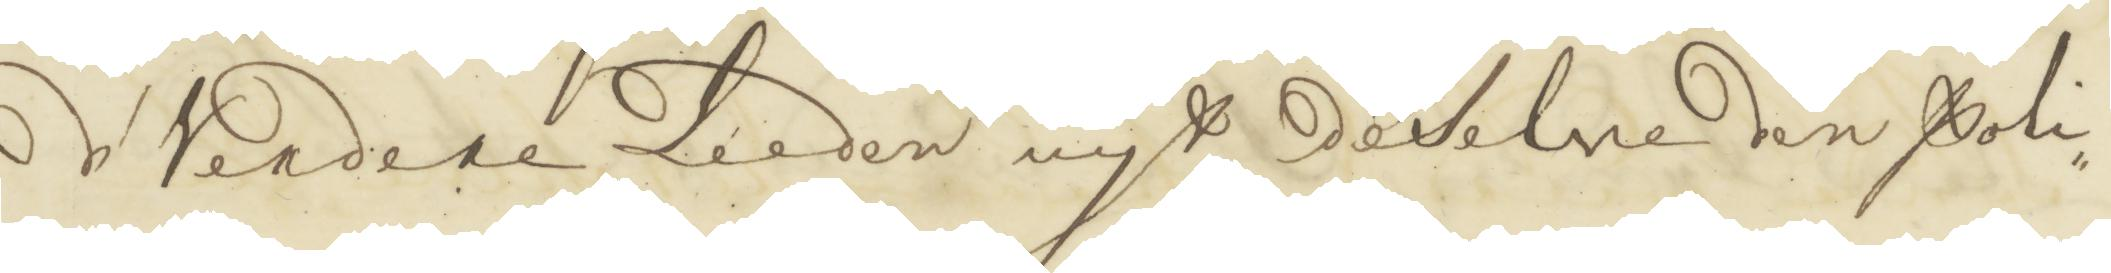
d'verdere Leeden uijt deselve den poli„
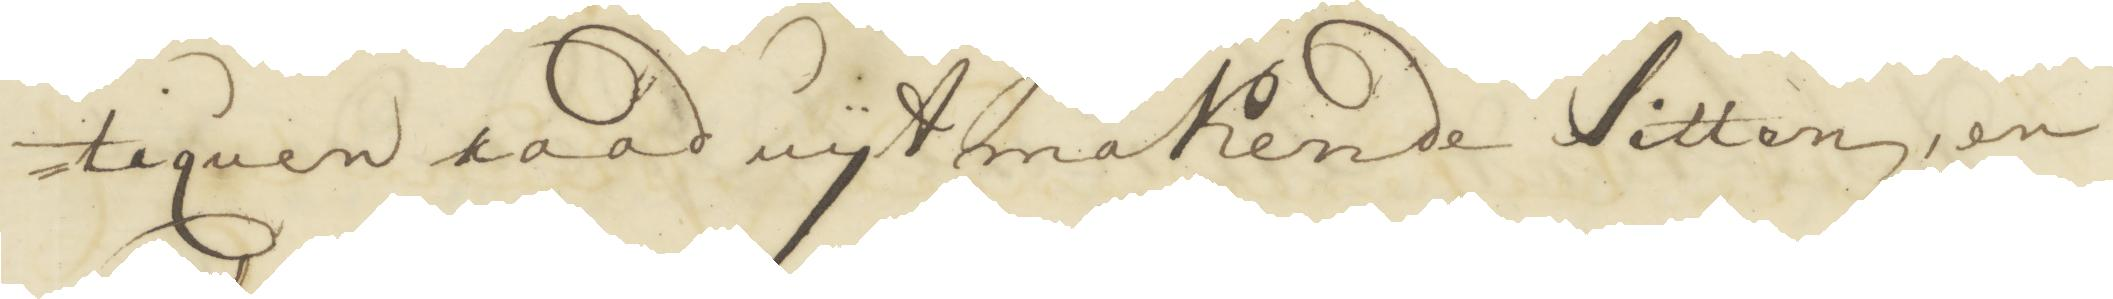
„tiquen raad uijtmakende sitten, en
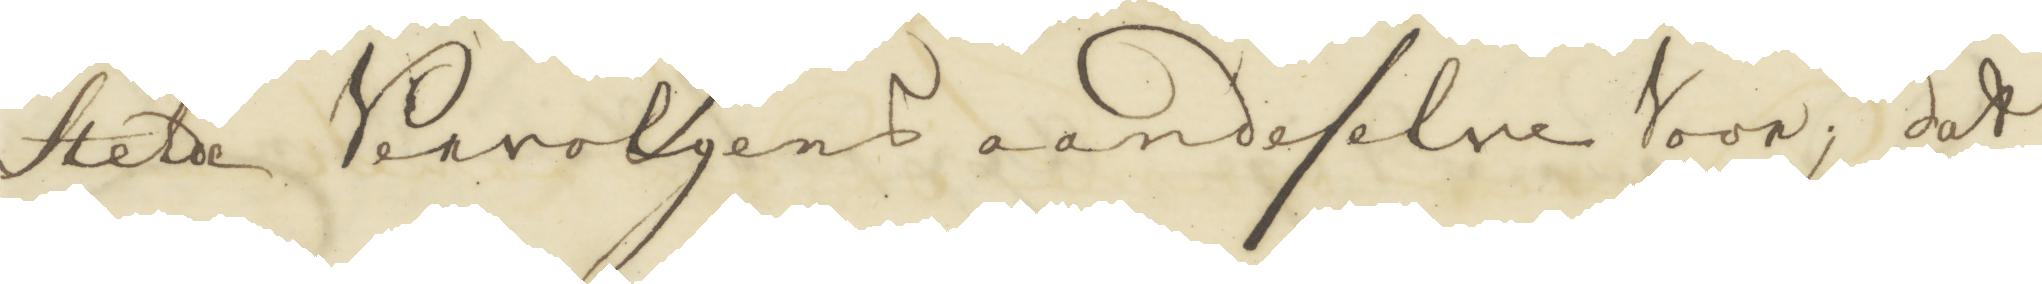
stelde vervolgens aan deselve voor; dat
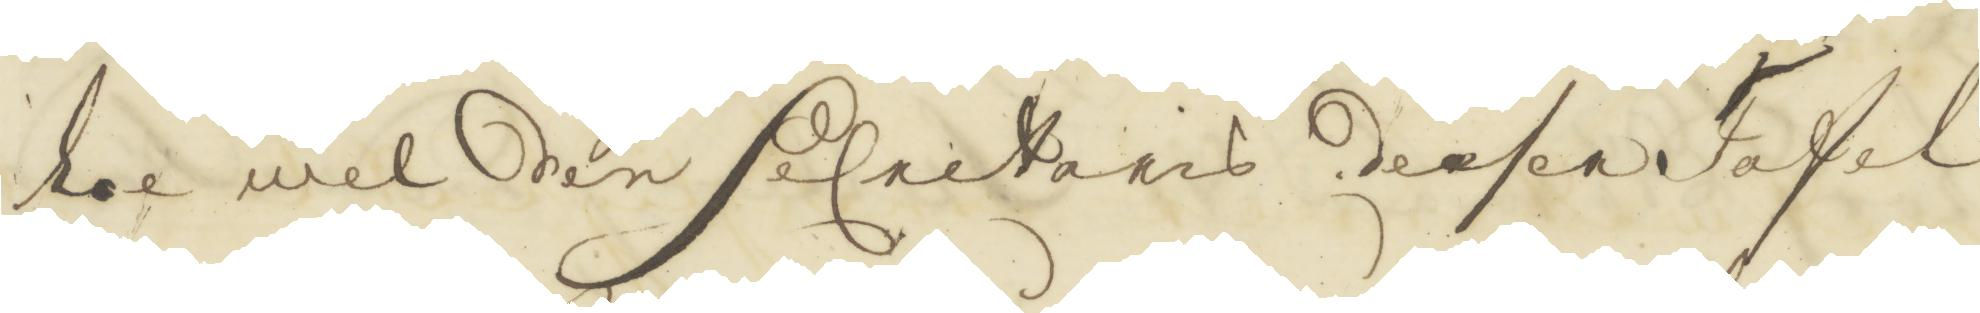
hoe wel den Secretaris deeser Tafel
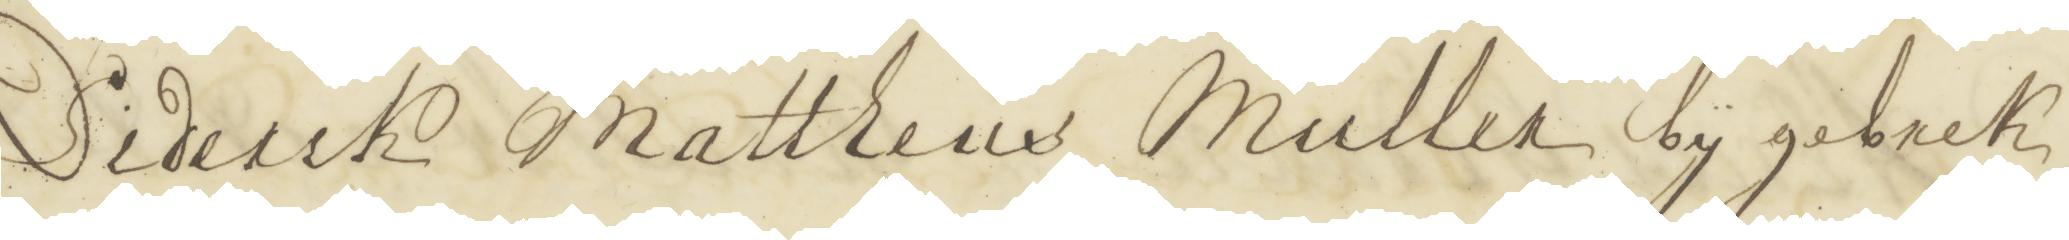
Diderik Mattheus Muller bij gebrek
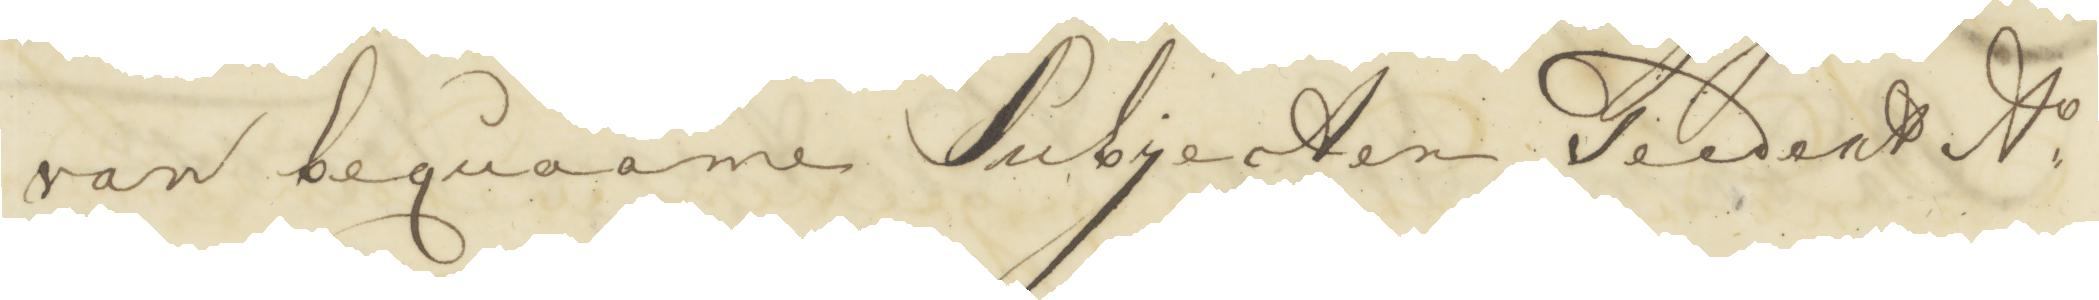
van bequaame subjecten seedert A„o
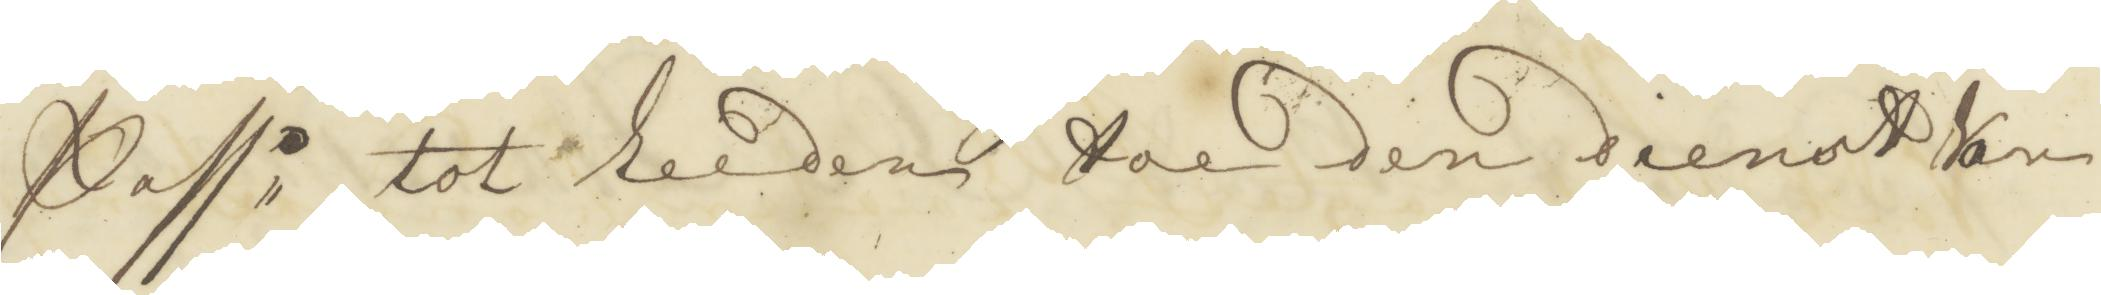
Pass„o tot heedens toe den dienst van
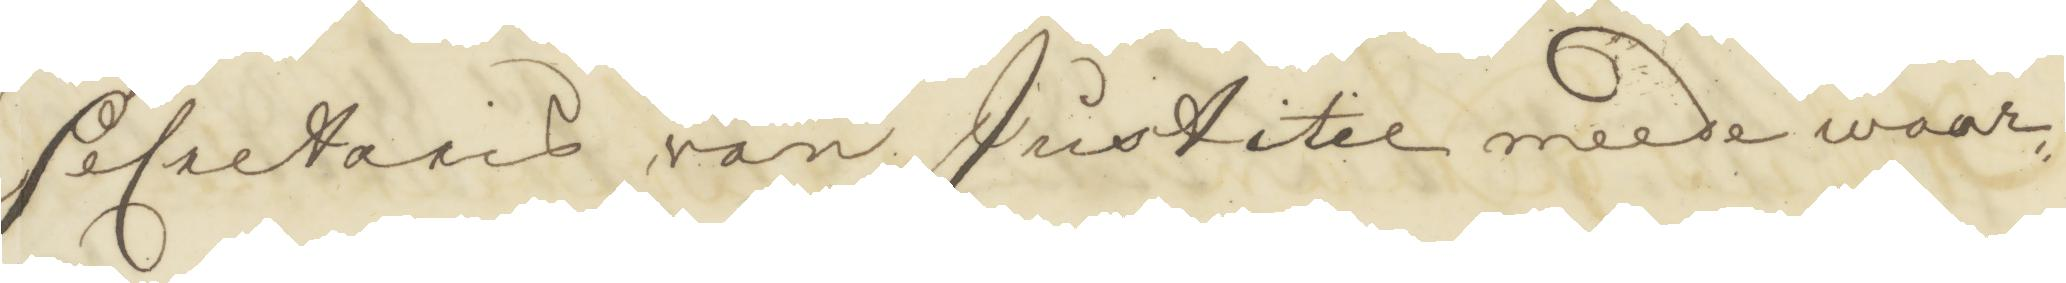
Secretaris, van Justitie meede waar„
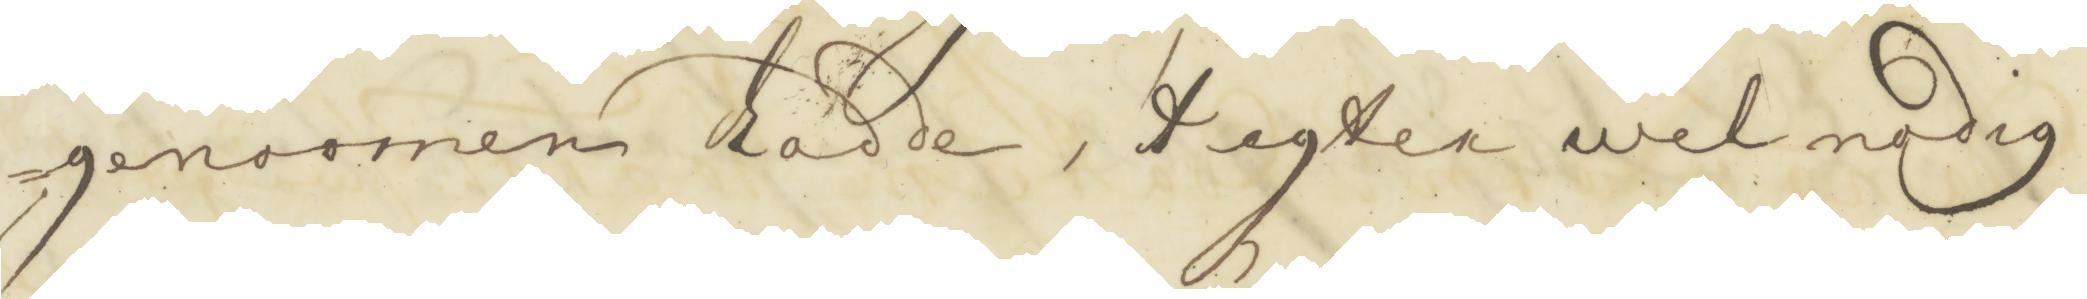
=genoomen hadde, 't egter wel nodig
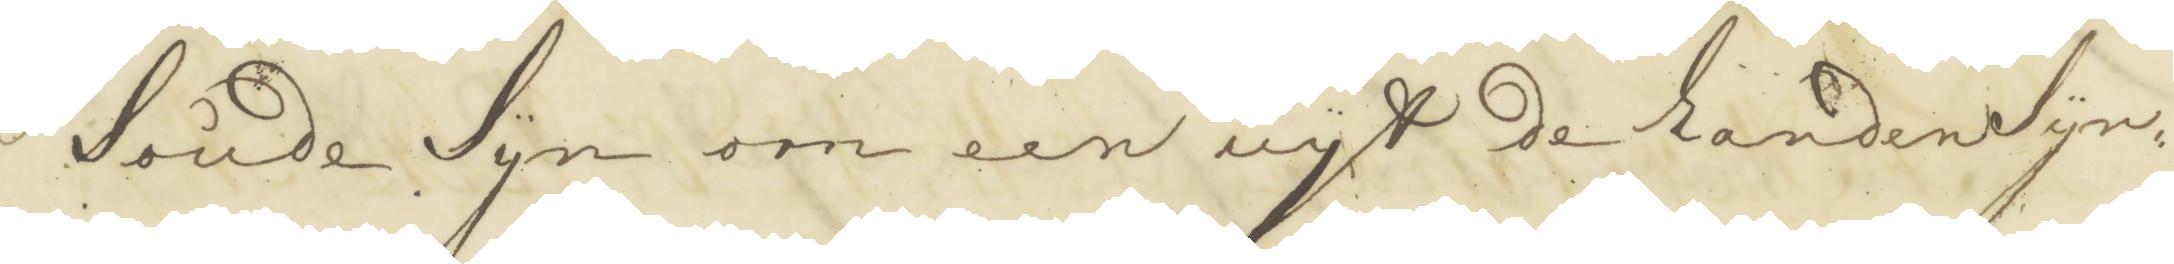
soude sijn om een uijt de handen sijn„
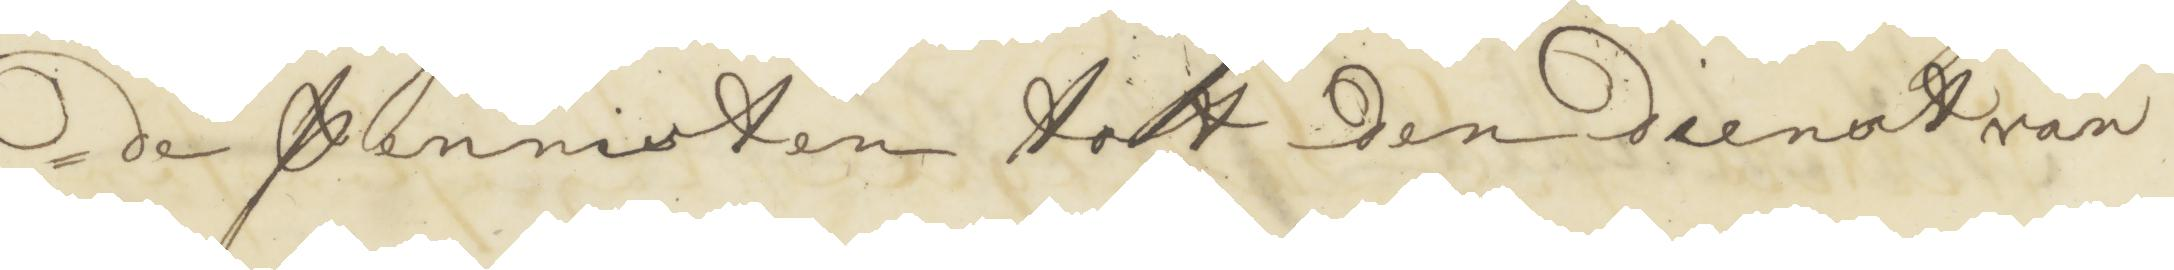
=de pennisten tot den dienst van
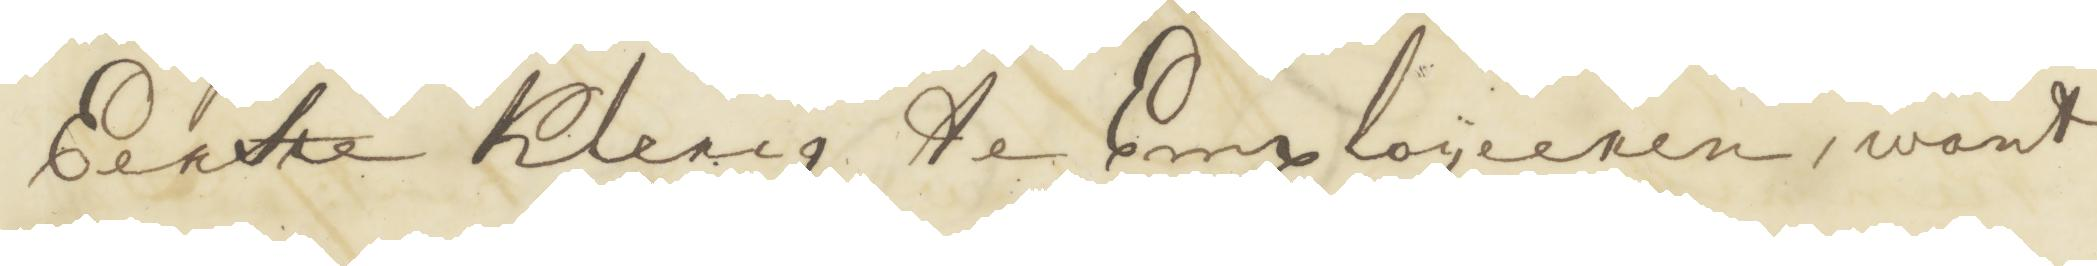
Eerste klercq te Emploijeeren, want
